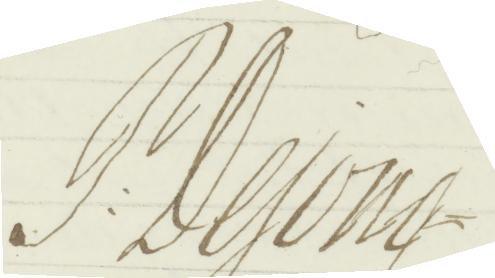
P: Dejong
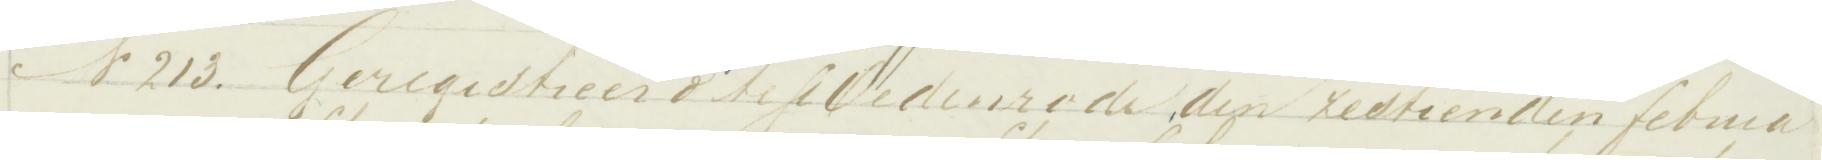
N 213. Geregistreerd te st Oedenrode, den zestienden februa
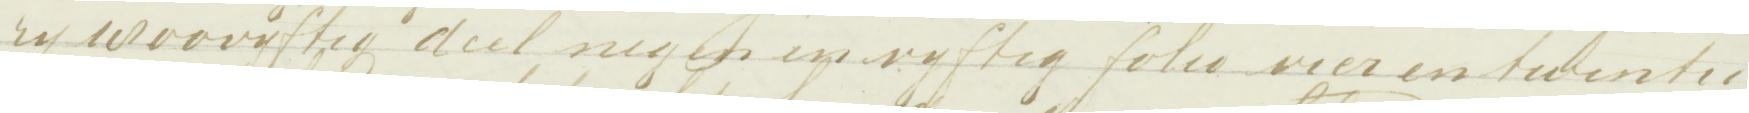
ry 1800 vyftig deel negen en vyftig folio vier en twintig
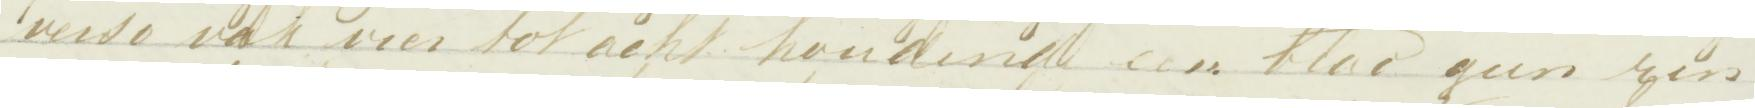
verso vak vier tot acht houdend een blad geen ren
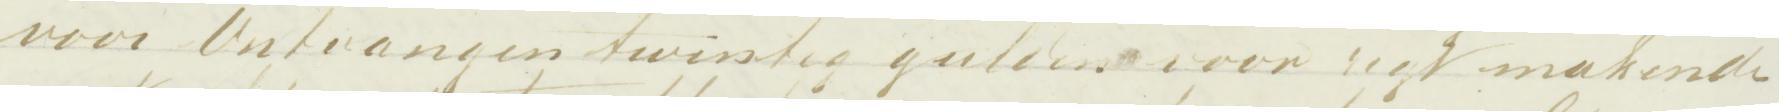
vooi Ontvangen twintig guldens voor regt makende
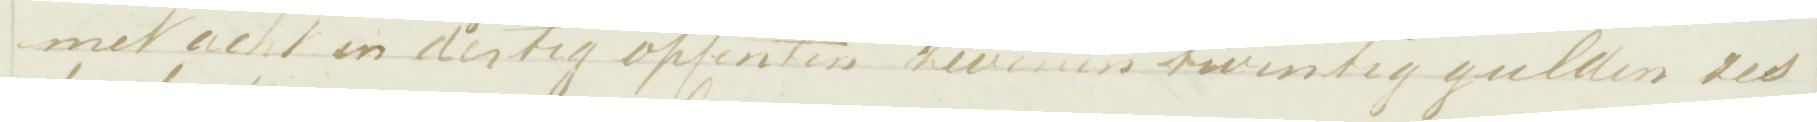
met acht en dertig opcenten zevenen twintig gulden zes
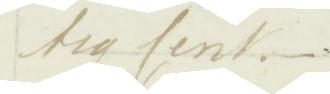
tig Cent.—
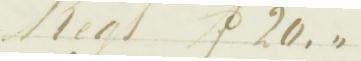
Regt ƒ 20. „
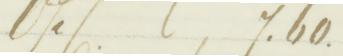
OpC. 7.60.
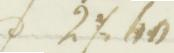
ƒ 27. 60
